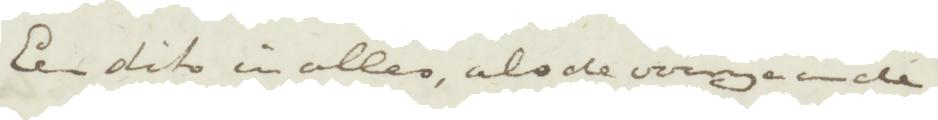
Een dito in alles, als de voorgaande
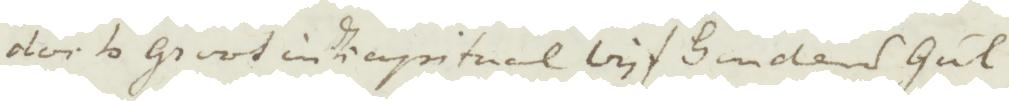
dorts Groot in Kapitaal vijf honderd Gul
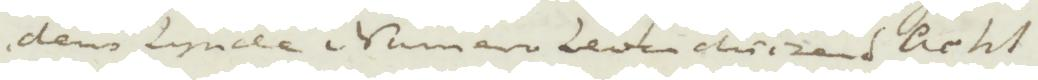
„dens zynde Numero zeven duizend acht
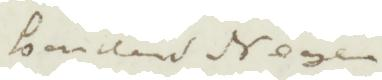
honderd Negen.
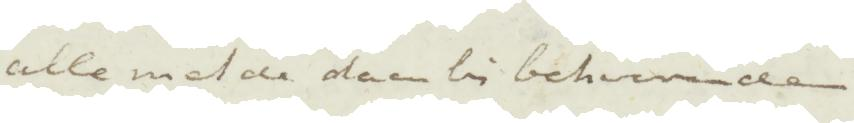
alle met de daarbij behoorenden
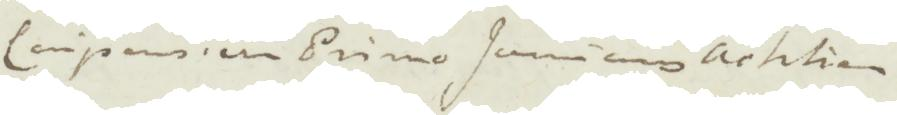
Coupons, van primo Januari achtien
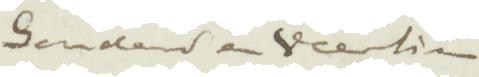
honderd en veertien
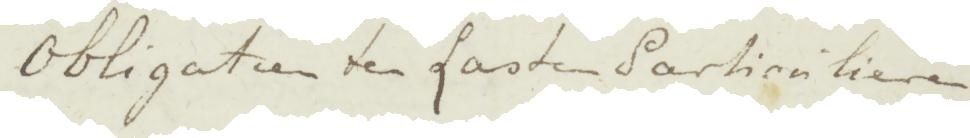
Obligatien ten Lasten Particulieren
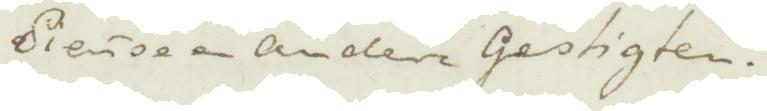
Pieuse en andere Gestigten.
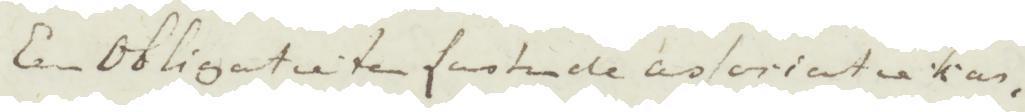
Een Obligatie ten Lastende associatie kas,
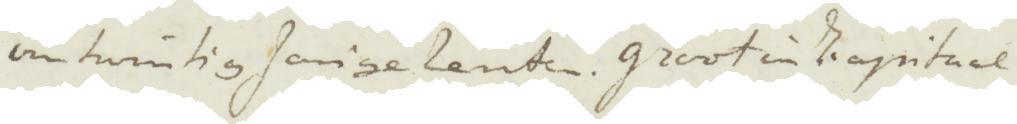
van twintig Jarige renten, groot in Kapitaal
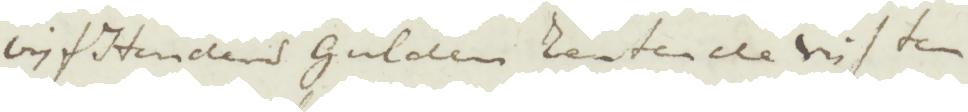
vijf Honderd Gulden rentende vijf ten
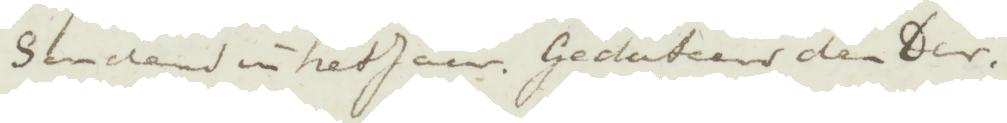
honderd in het Jaar, Gedateerd den Der,
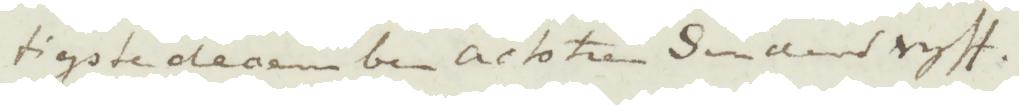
tigste december achtien honderd vyff.
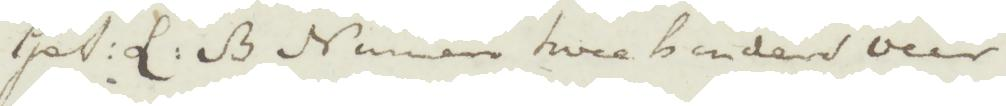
Get: L: B Numero twee honderd veer
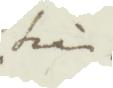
„tien.
